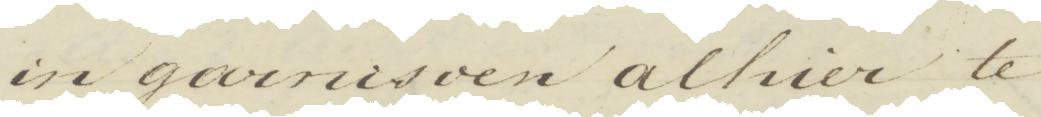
in garnisoen alhier te
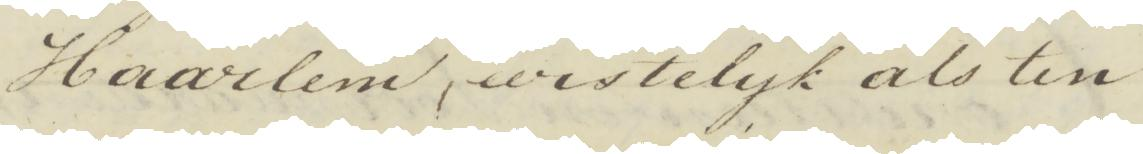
Haarlem, eerstelyk als ten
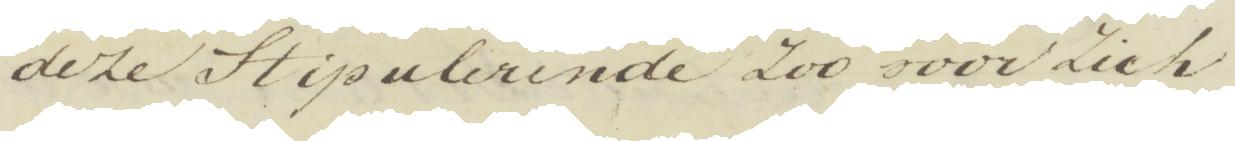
deze stipulerende zoo voor zich
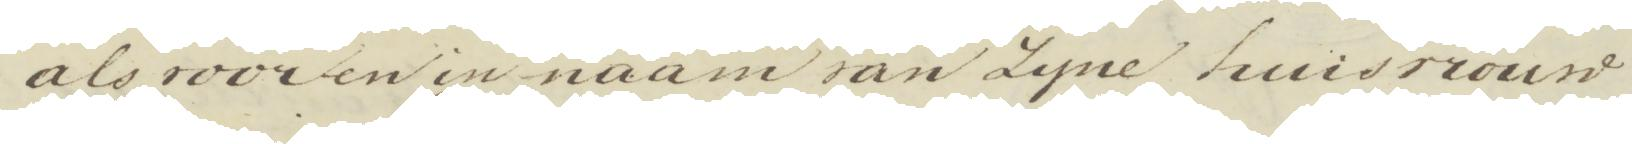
als vooren in naam van zijne huisvrouw
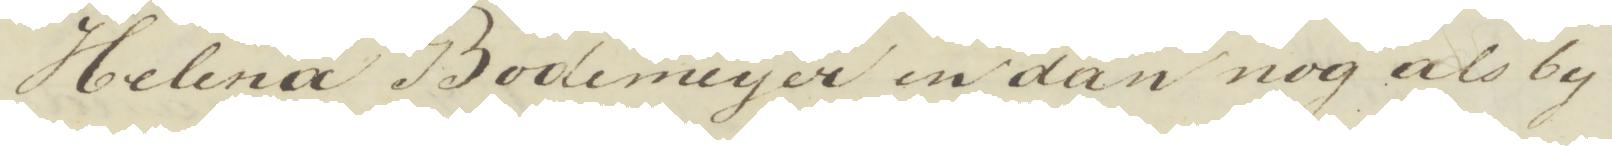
Helena Bodemeyer en dan nog als by
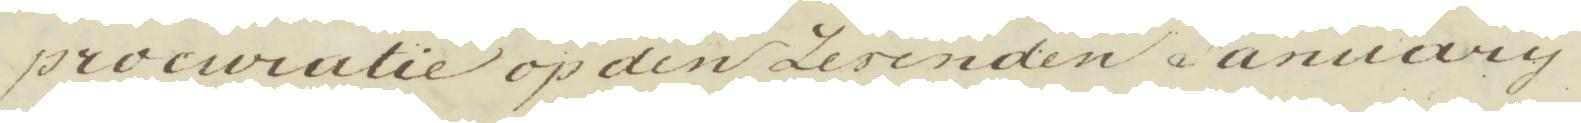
procuratie op den Zevenden Ianuary
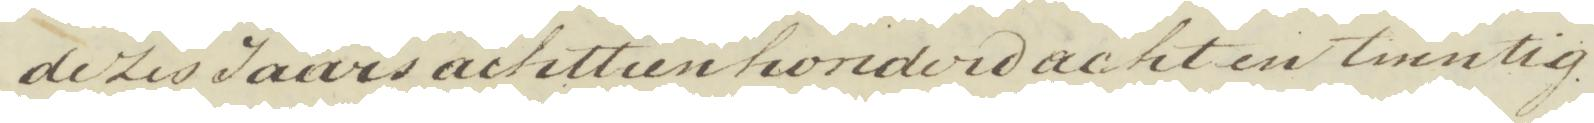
dezes Iaars achttien honderd acht en twintig.
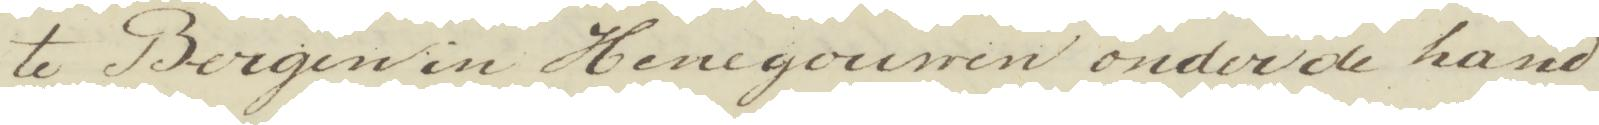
te Bergen in Henegouwen onder de hand
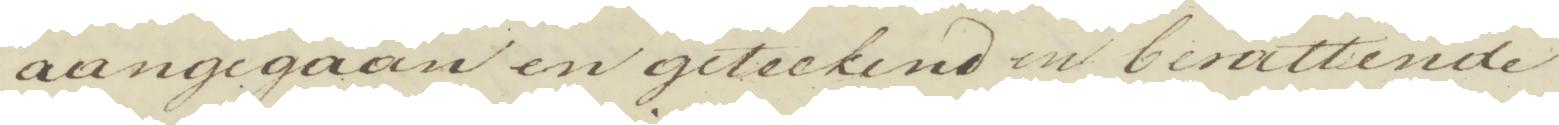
aangegaan en geteekend en bevattende
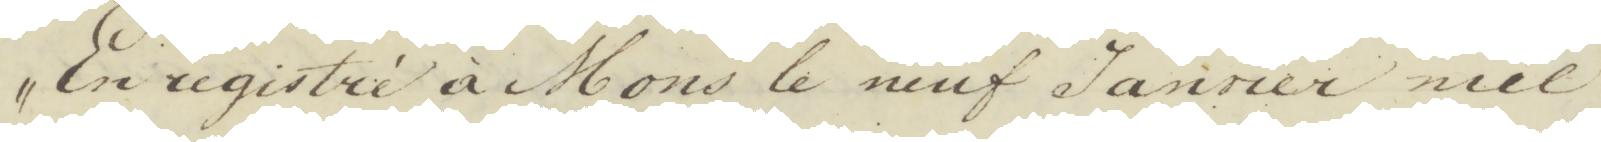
„En registré a Mons le neuf Ianvier mil
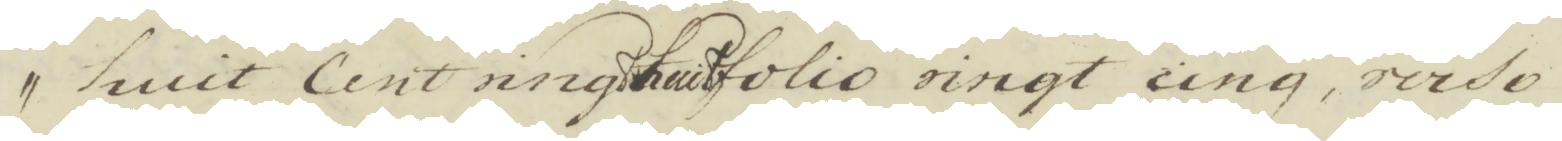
„ huit Cent vingt huit folio vingt cinq, verso
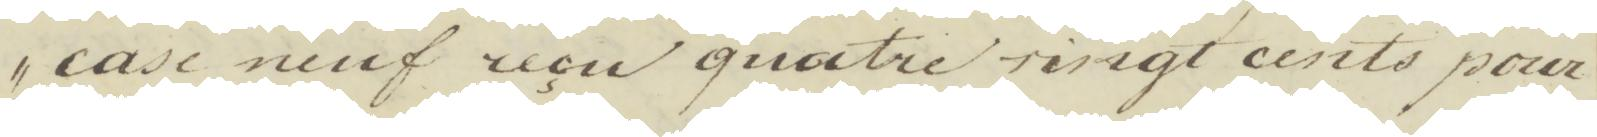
„case neuf reçu quatre vingt cents pour
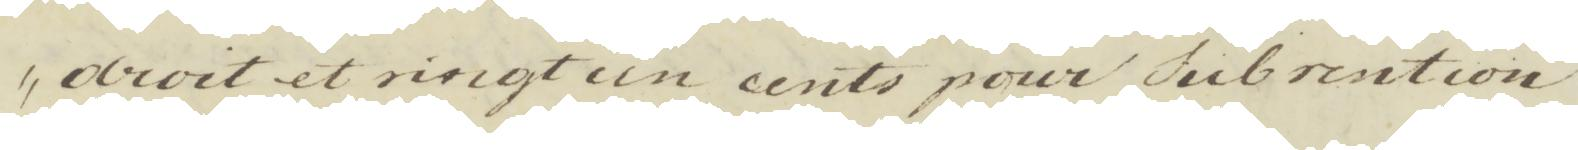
„droit et vingtun cents pour subvention
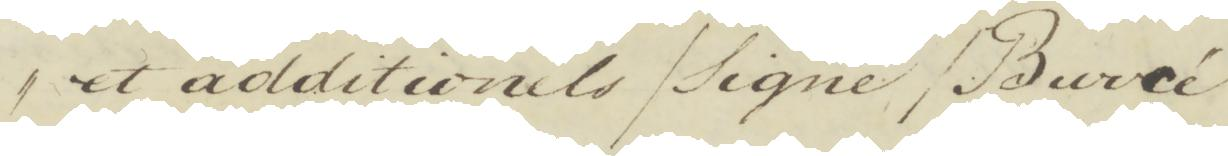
„et additionels /signé / Burcé
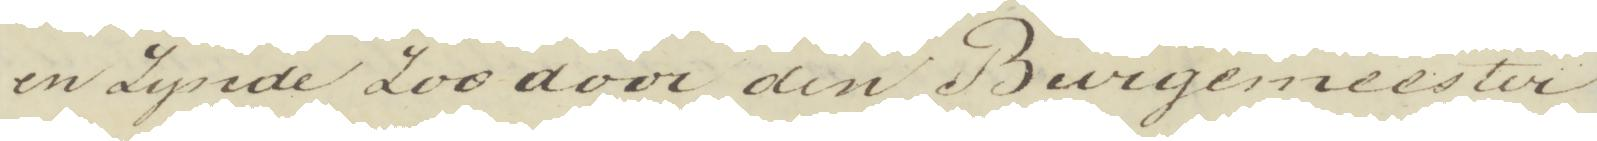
en zijnde zoo door den Burgemeester
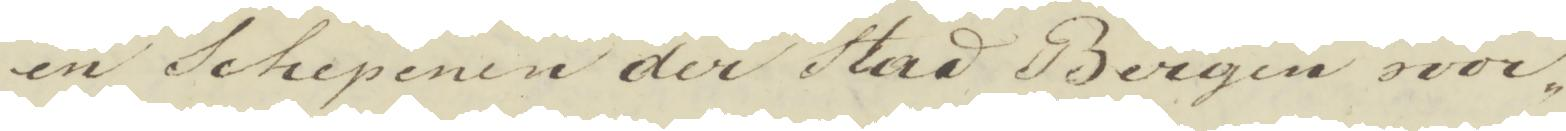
en schepenen der stad Bergen voor„
